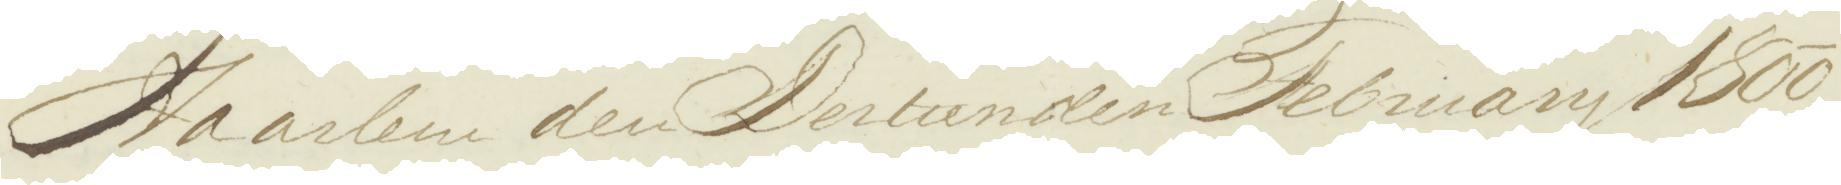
Haarlem den Dertienden February 1800
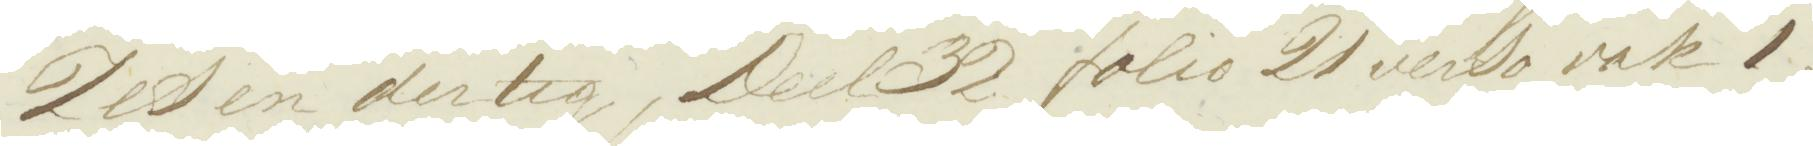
Zes en dertig, Deel 32 folio 21 verso vak 1
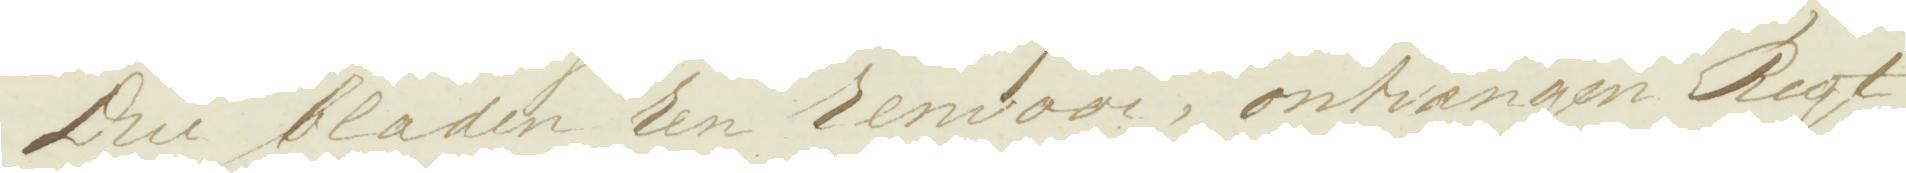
Drie bladen Een renvoor, ontvangen Regt
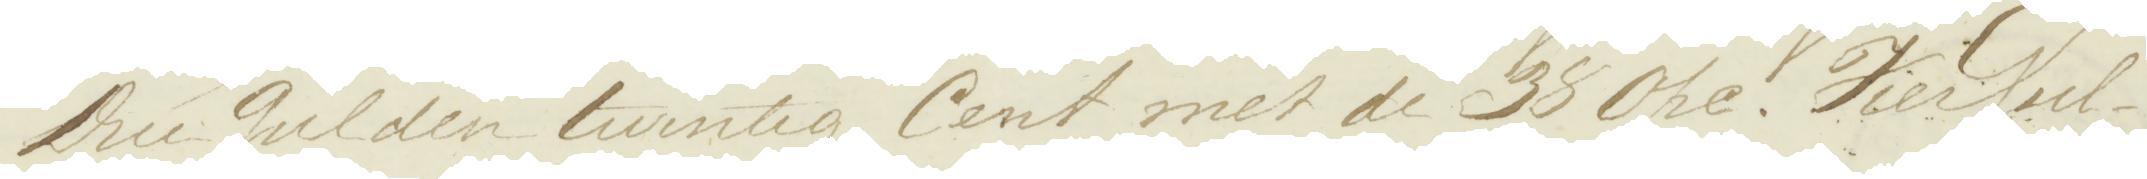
Drie gulden twintig Cent met de 35 Opc. Vier Gul=
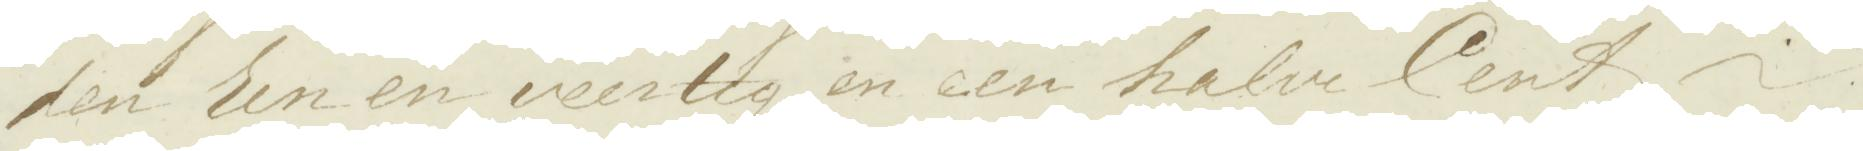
den Een en veertig en een halve Cent
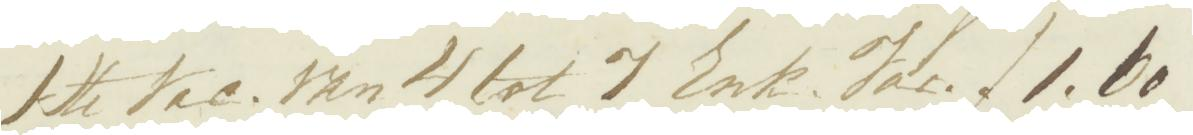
1ste Vac. van 4 tot 7 Enk. Iac. ƒ 1,60
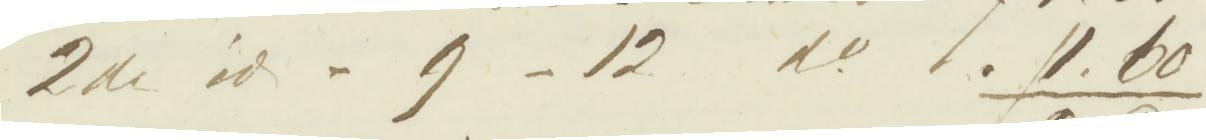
2de id - 9 - 12. d.o . 1,60
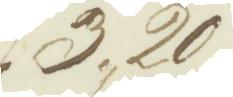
3,20
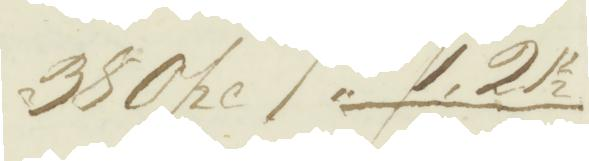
38 Opc „ 1,21½
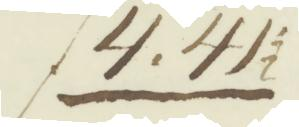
ƒ4,41½.
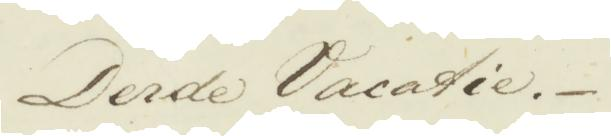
Derde Vacatie. —
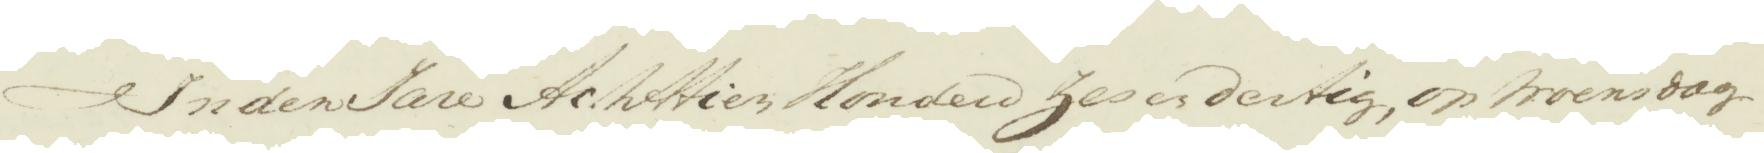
In den Iare Achttien Honderd Zes en dertig, op woensdag
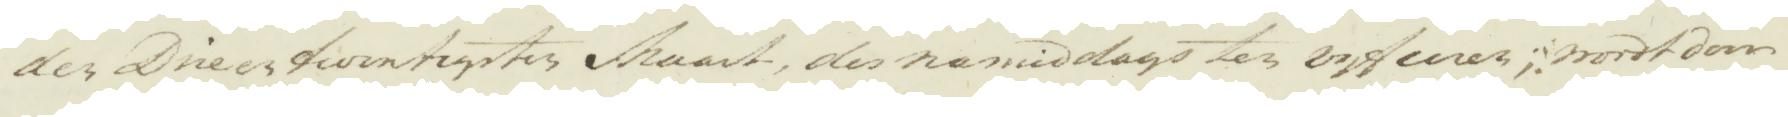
den Drie en twintigsten Maart, des namiddags ten vyf uren; wordt door
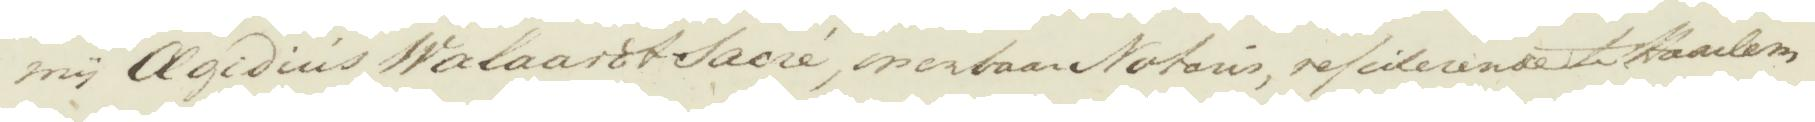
mij AEgidius Walaardt Sacré, openbaar Notaris, residerende te Haarlem
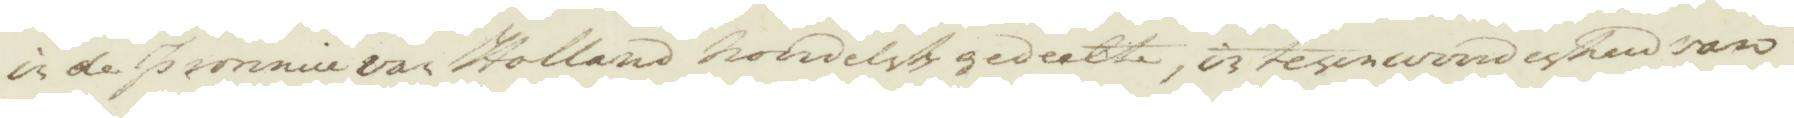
in de provincie van Holland noordelyk gedeelte, in tegenwoordigheid van
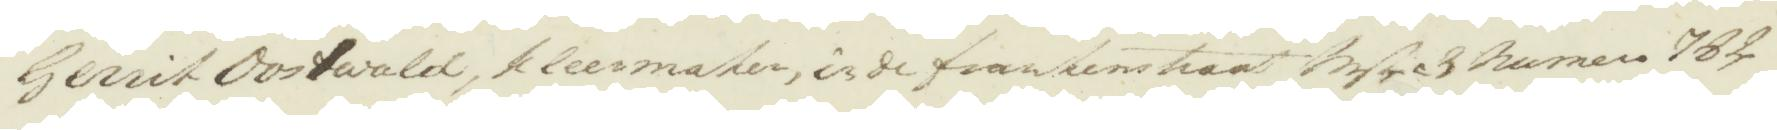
Gerrit Oostwald, kleermaker, in de frankenstraat Wyk 3 numero 782
